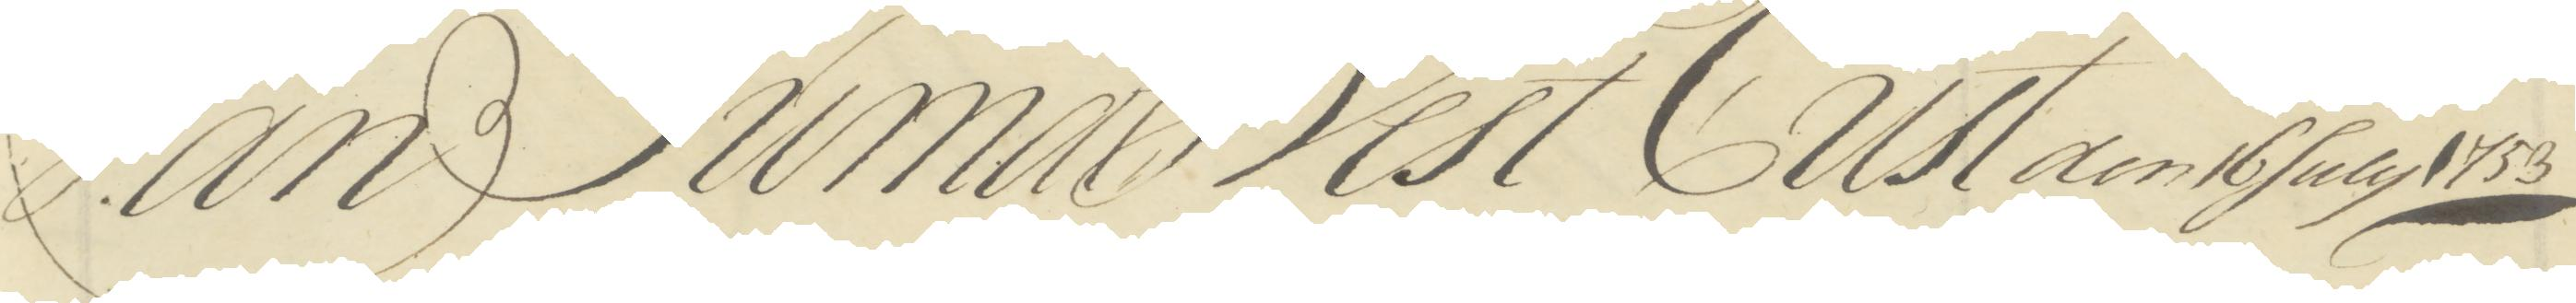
Van Sumat:s West Cust den 16 july 1753
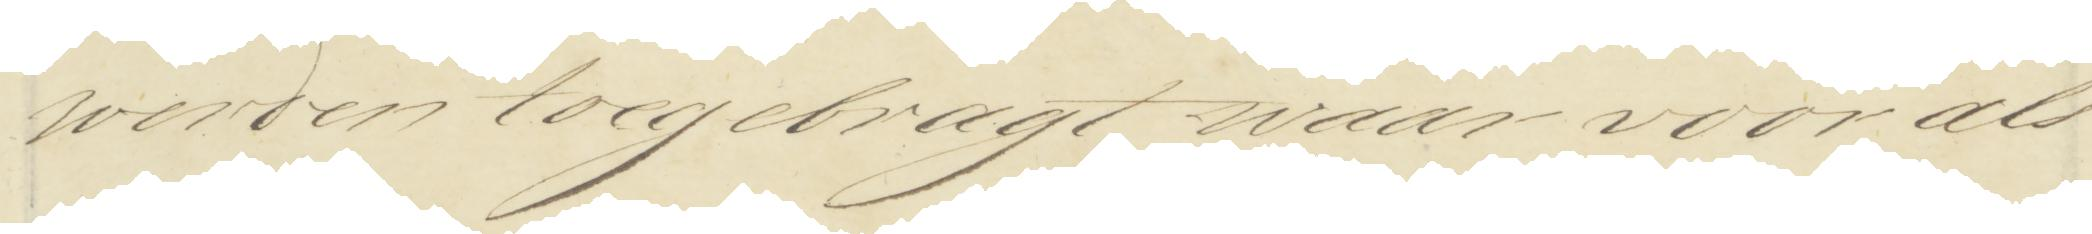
werden toegebragt waar voor als
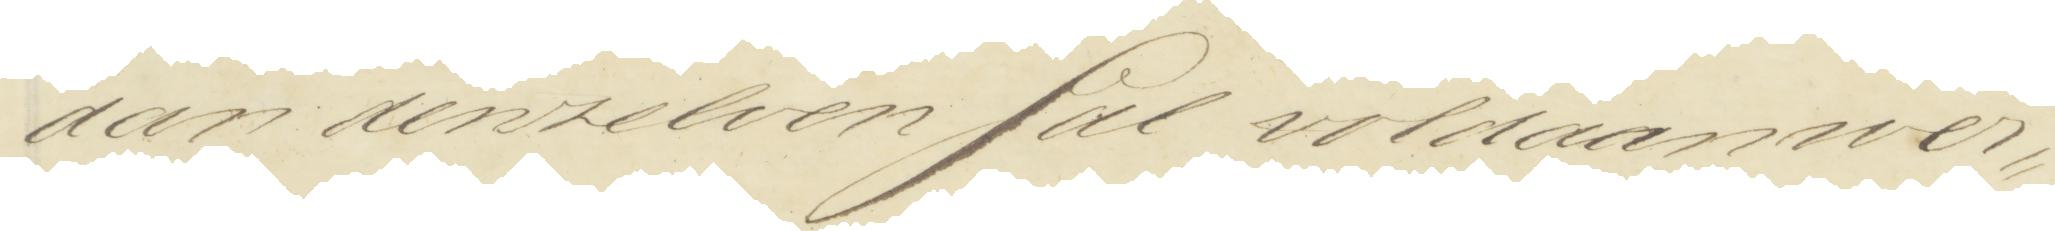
dan denzelven Sal voldaan wer=
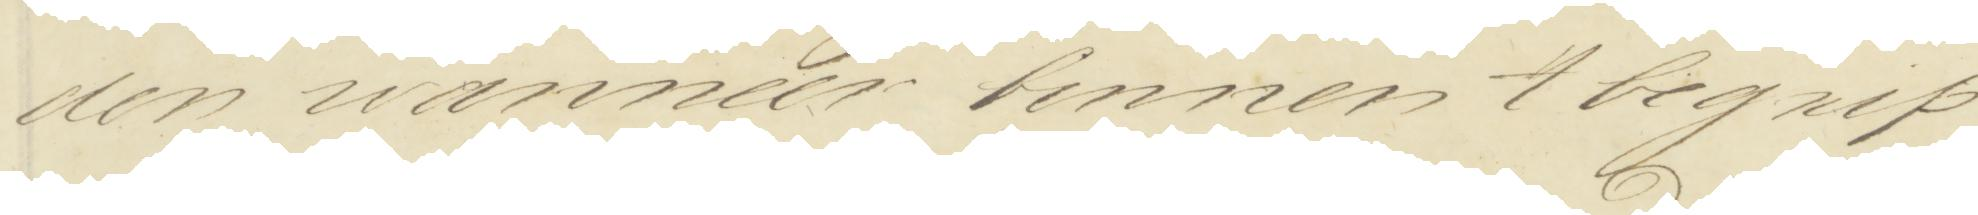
den wanneer binnen ’t begrip
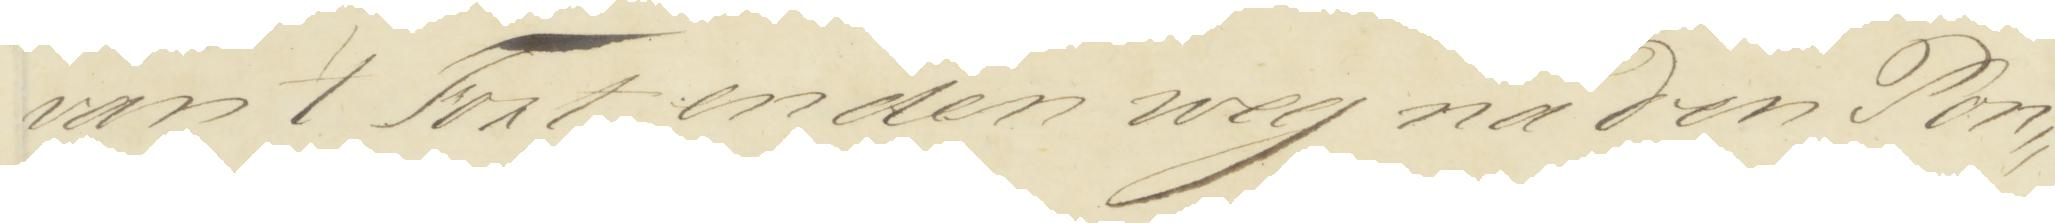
van 't Fort en den weg na den Pon=
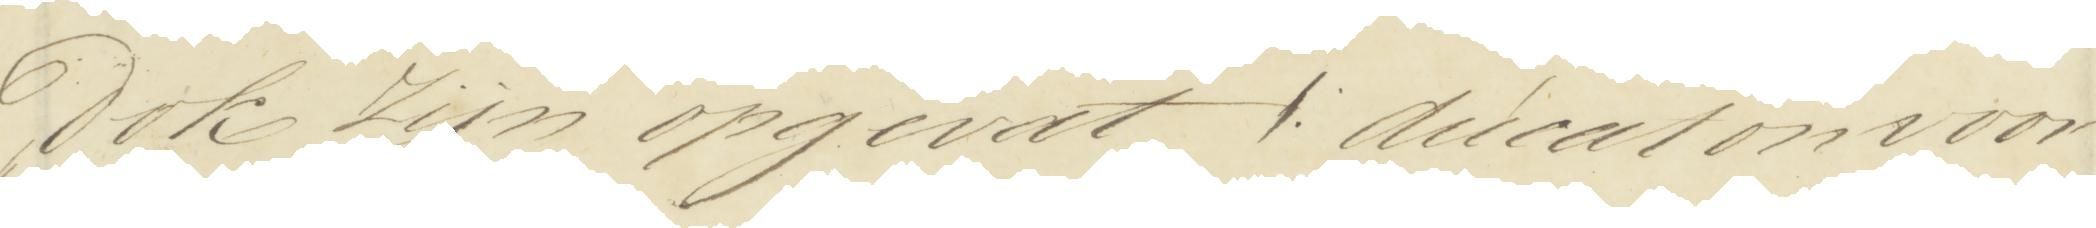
dok zijn opgevat 1: ducaton voor
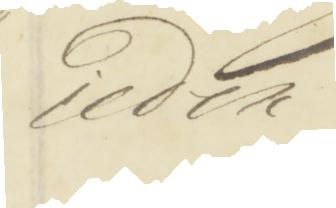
ieder
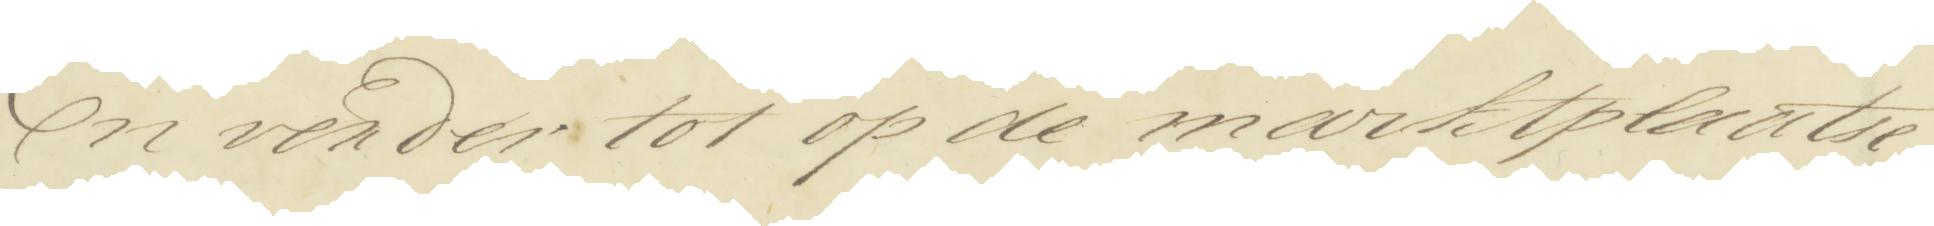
En verder tot op de marktplaatse
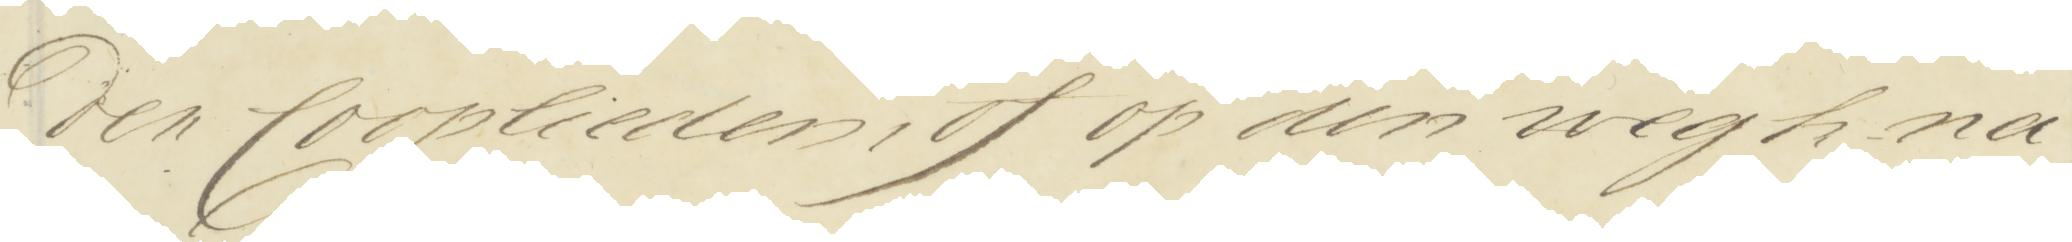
der Cooplieden of op den wegh na
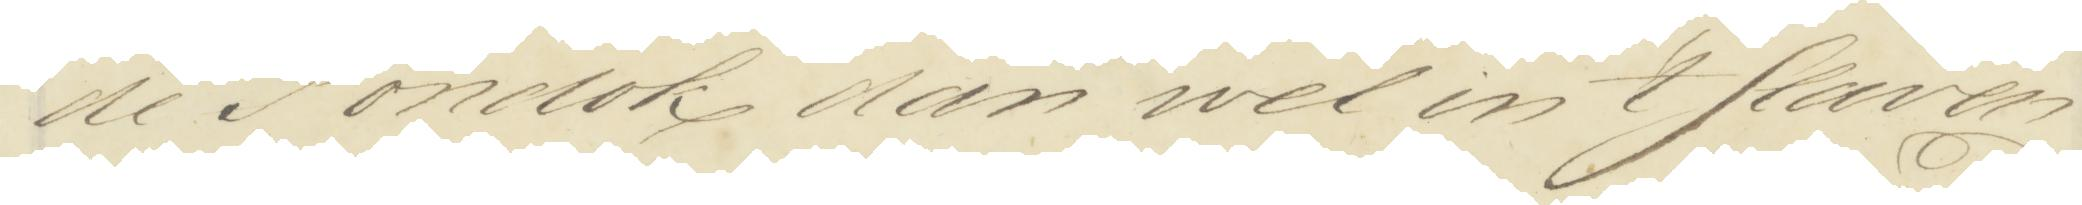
die Pondok dien wel in ’t Slaven
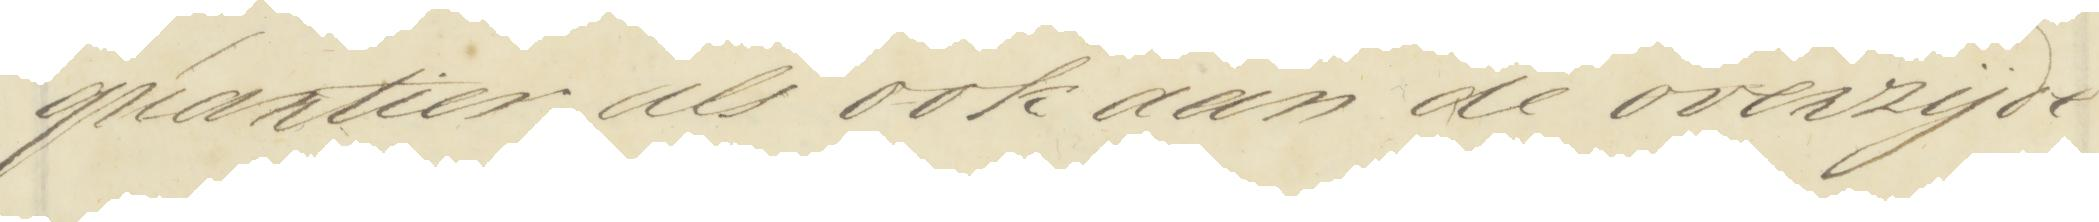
quartier als ook aan de overzijde
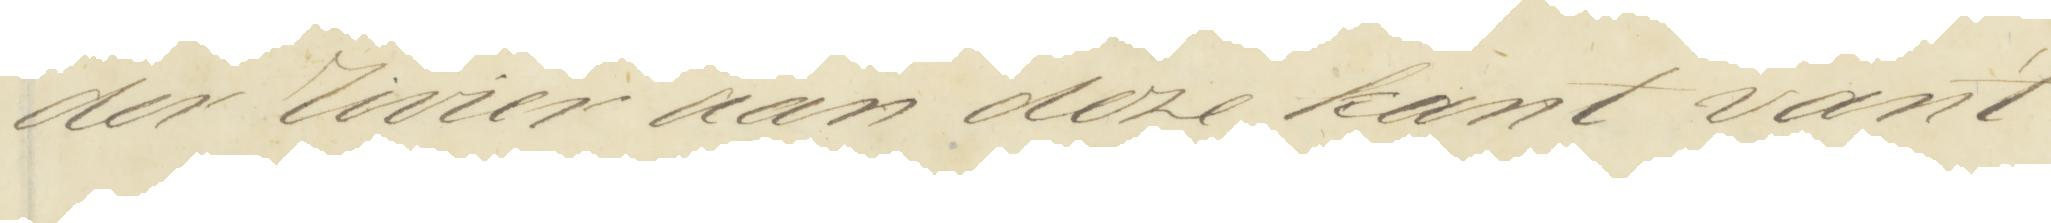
der rivier aan deze kant van't
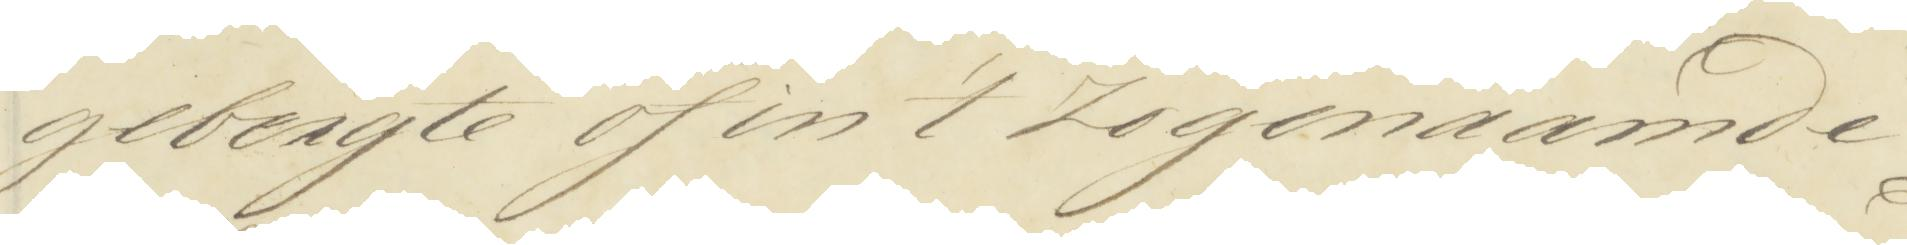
gebergte of in ’t Zogenaamde
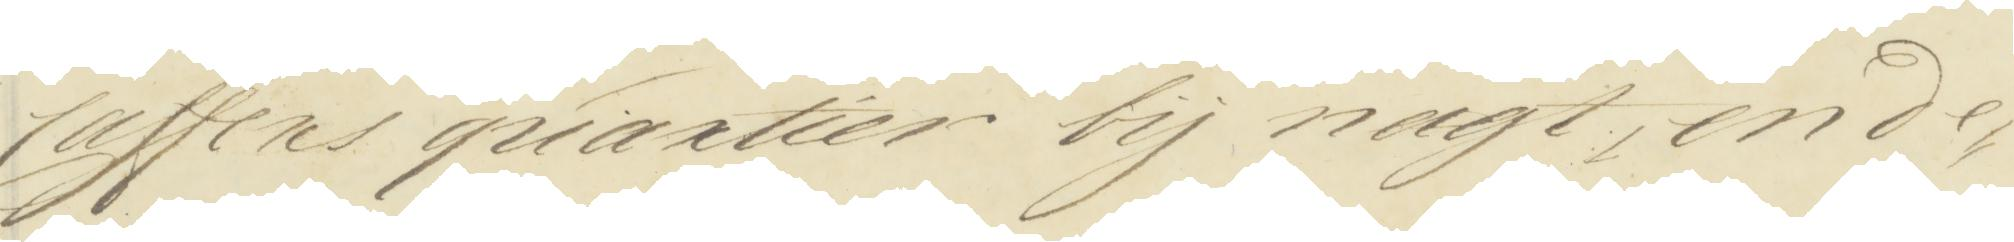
Caffers quartier bij nagt, en de=
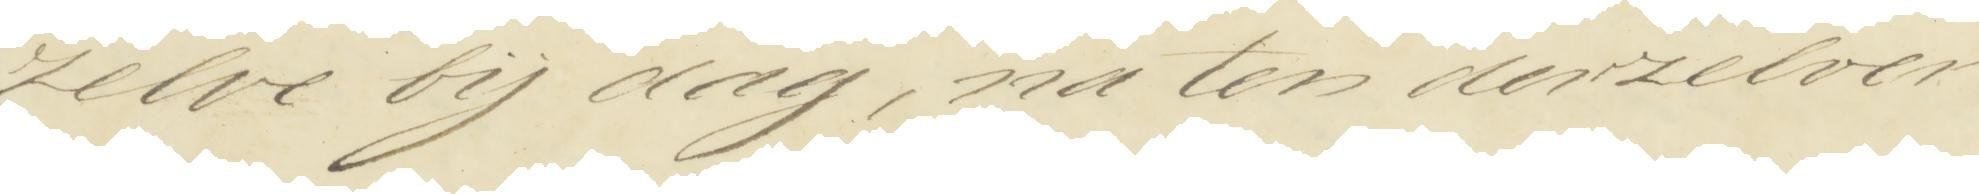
zelve bij dag na ten derzelver
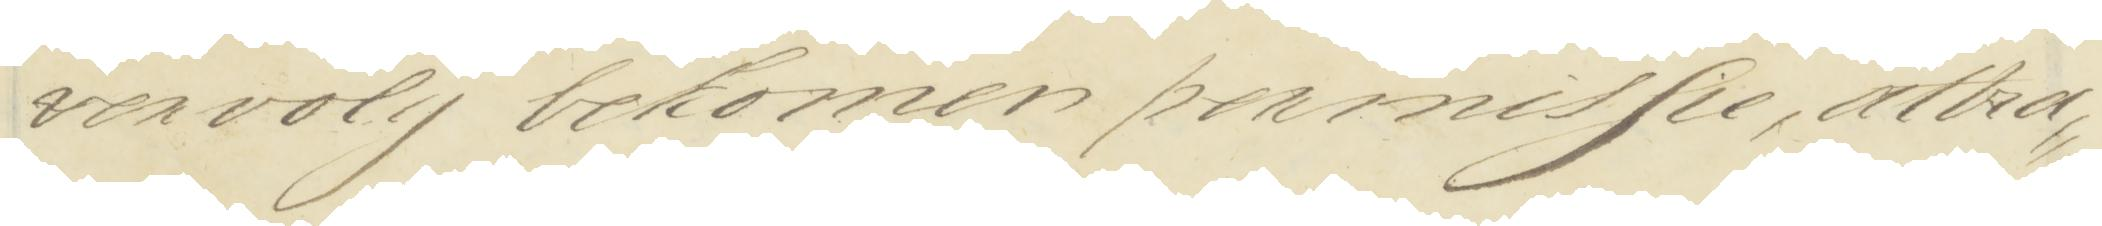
vervolg bekomen permissie, attra„
